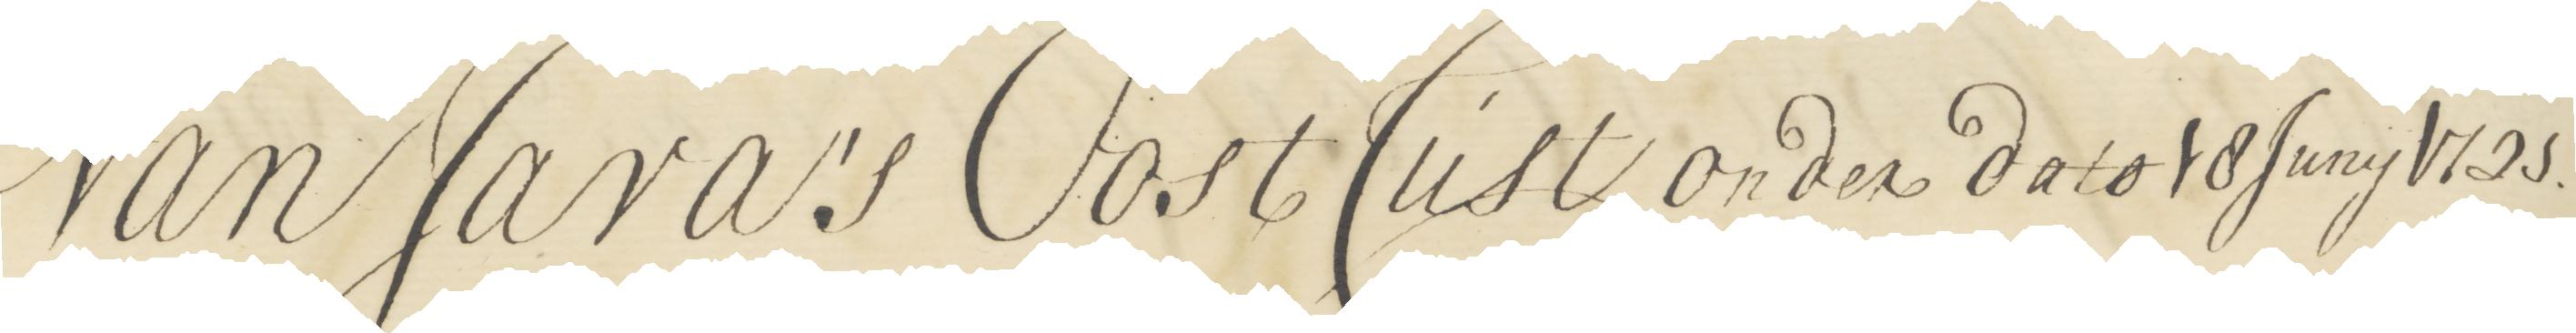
Van Java's Oost Cust onder dato 18 Junij 1721
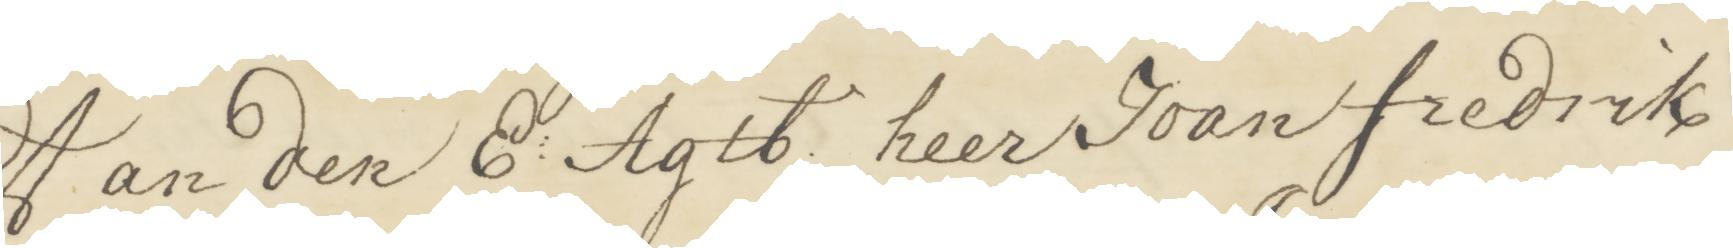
Aan den E: Agtb: heer Joan fredrik
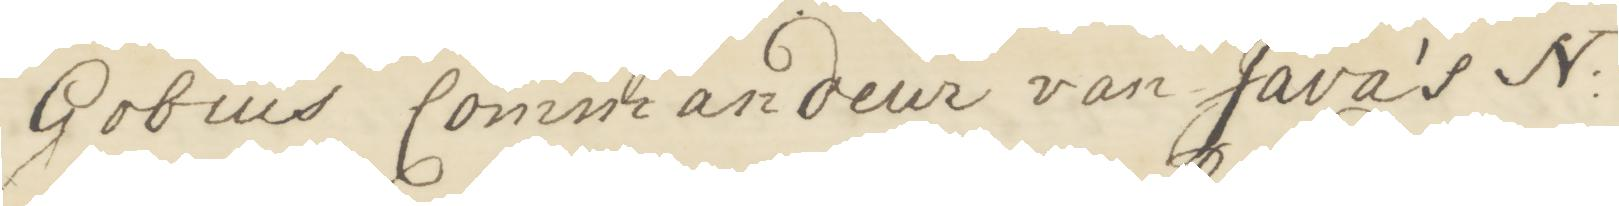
Gobius Commandeur van Java's N:t
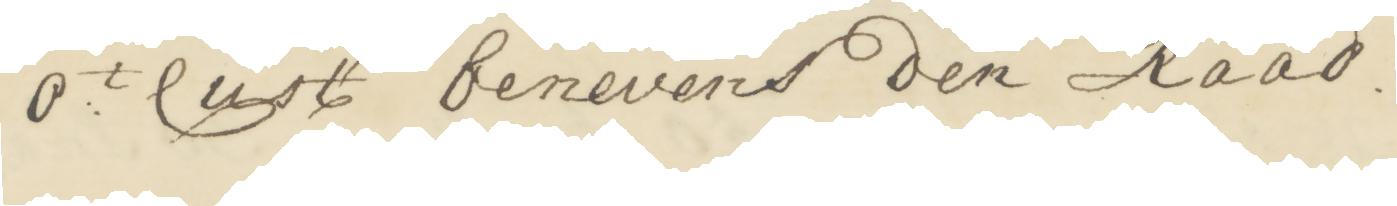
O:t Cust benevens den Raad
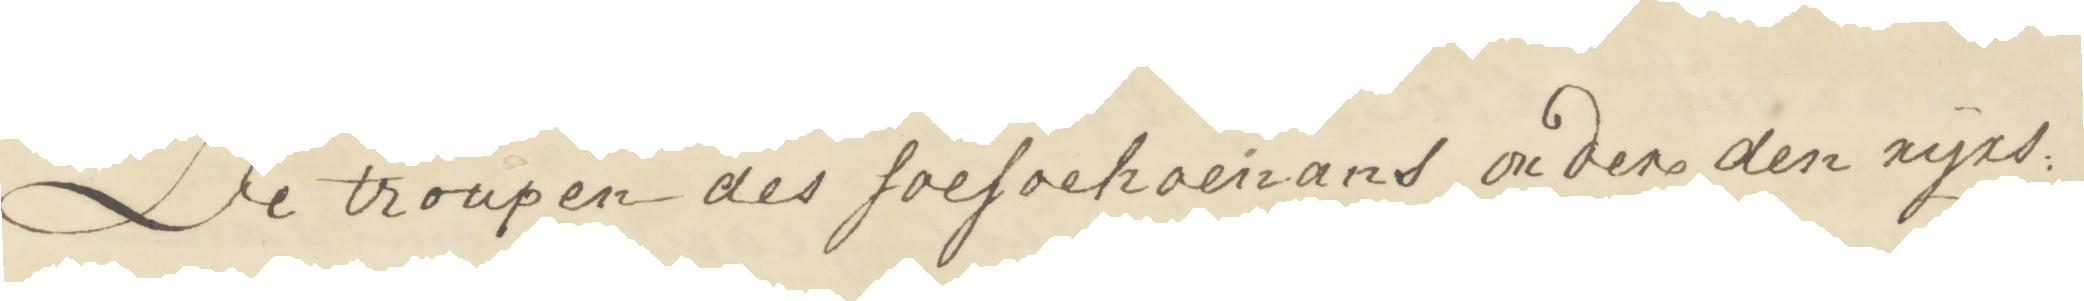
De troupen des soesoehoenans onder den rijxs:
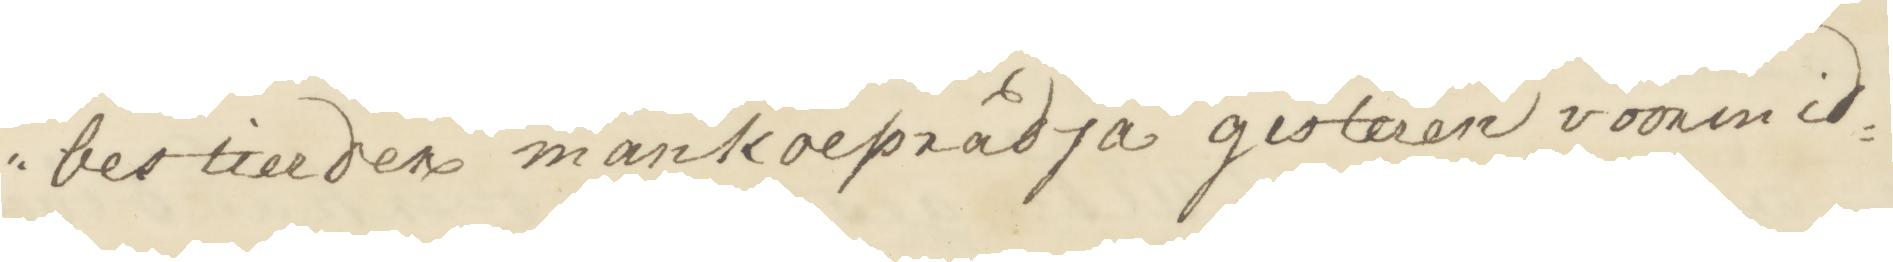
„bestierder mankoepradja gisteren voormid„
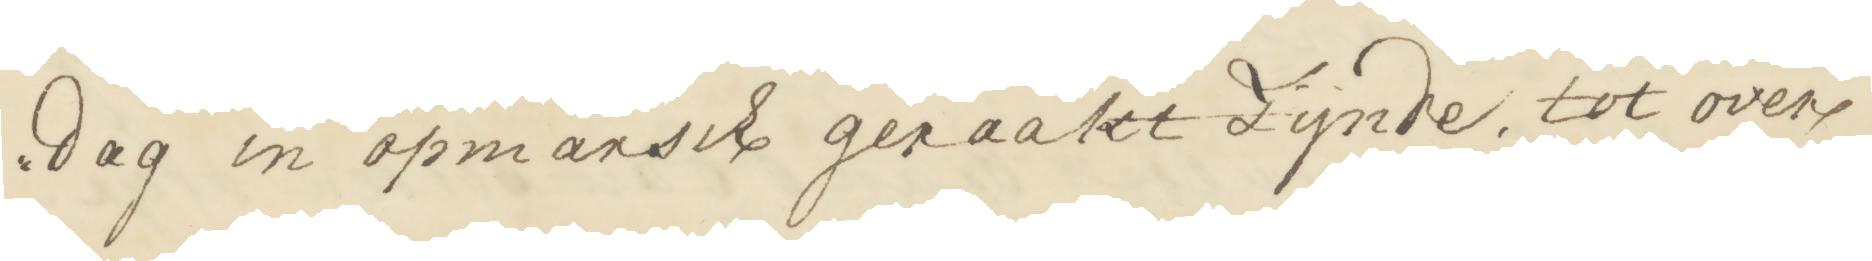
„dag in opmarsch geraakt zijnde, tot over
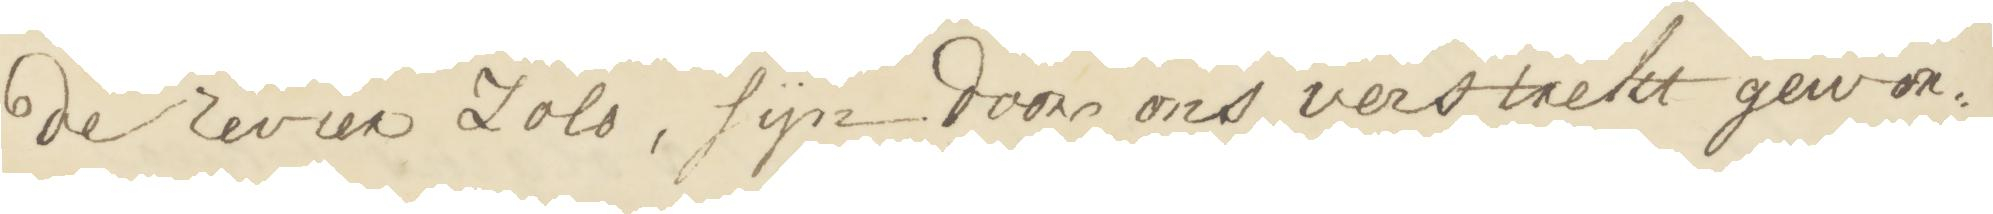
de revier zolo, sijn door ons verstrekt gewor„
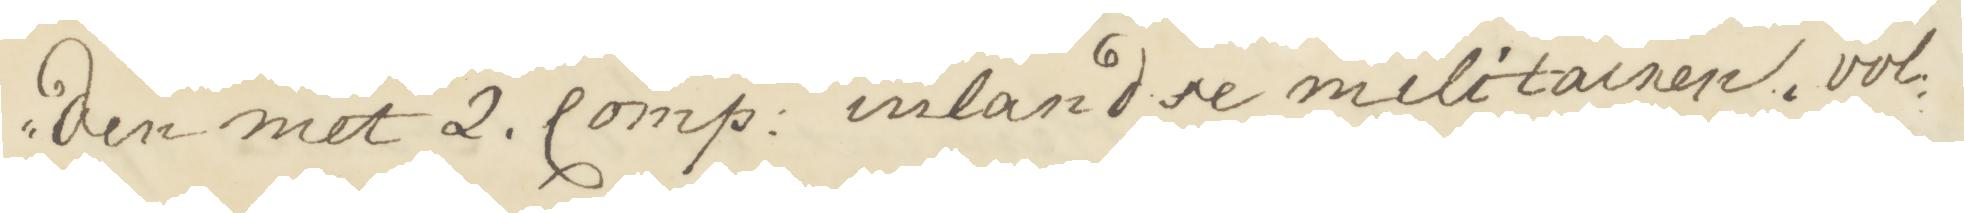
„den met 2. Comp: inlandse militairen, vol„
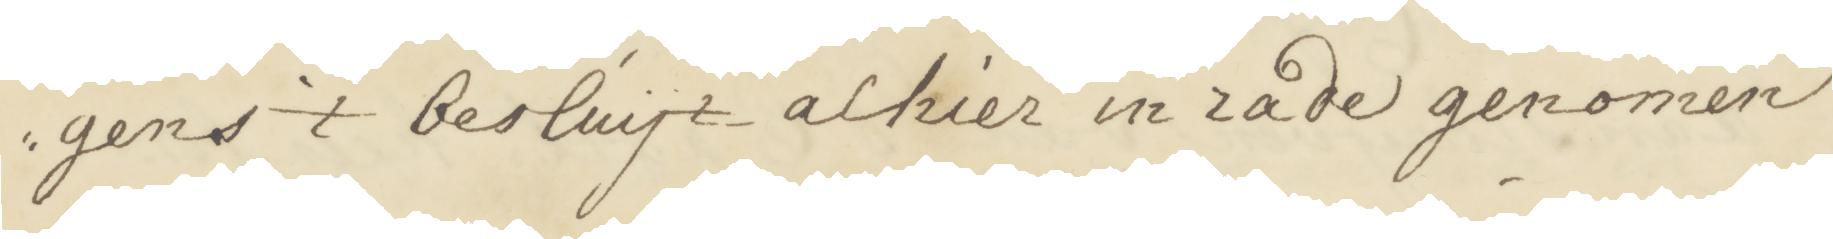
„gens 't besluijt alhier in rade genomen
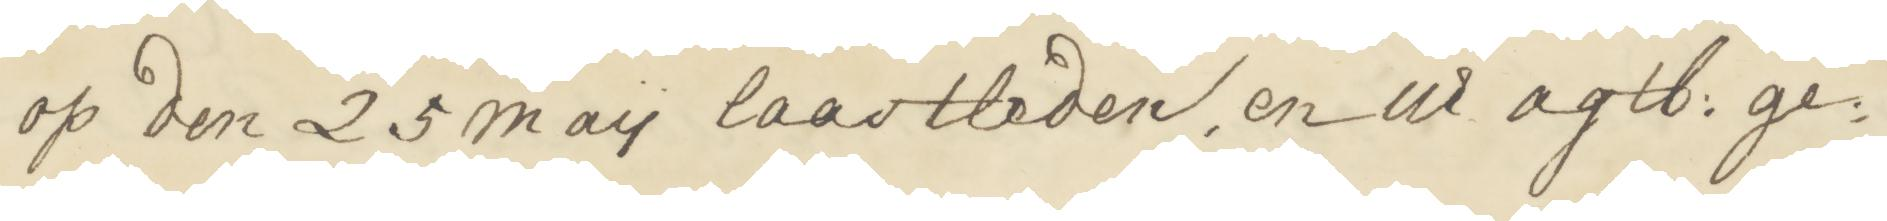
op den 25 maij laastleden, en uE agtb: ge„
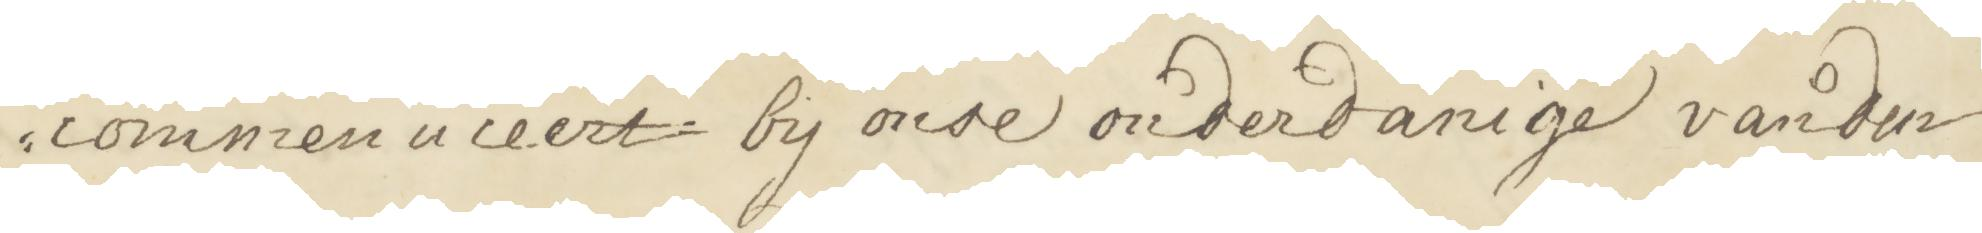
„commenuceert bij onse onderdanige vanden
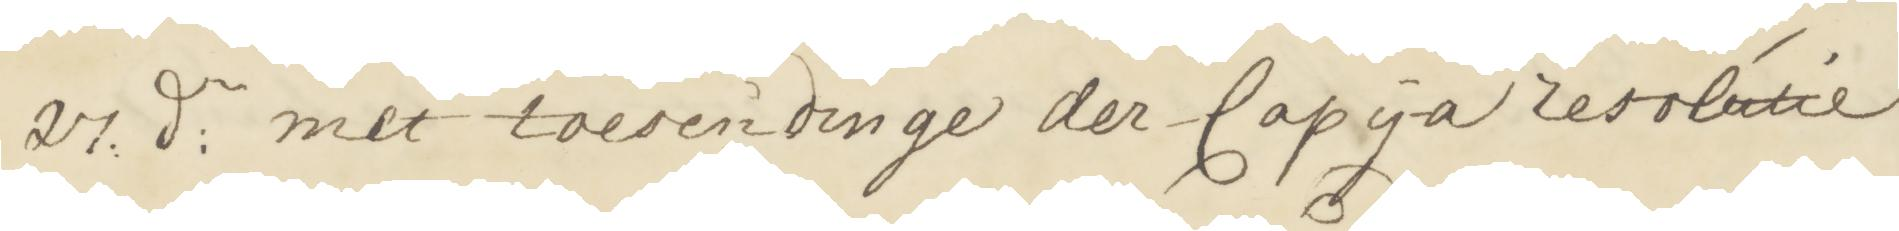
27. d: met toesendinge der Capija resolutie
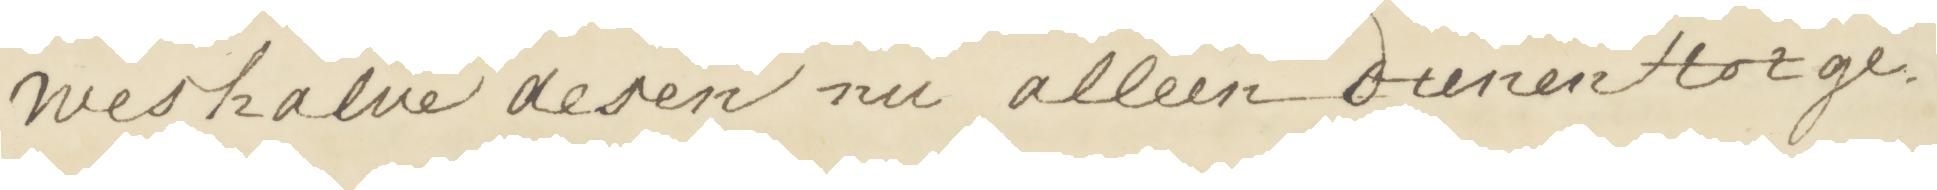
weshalve desen nu alleen dienen tot ge„
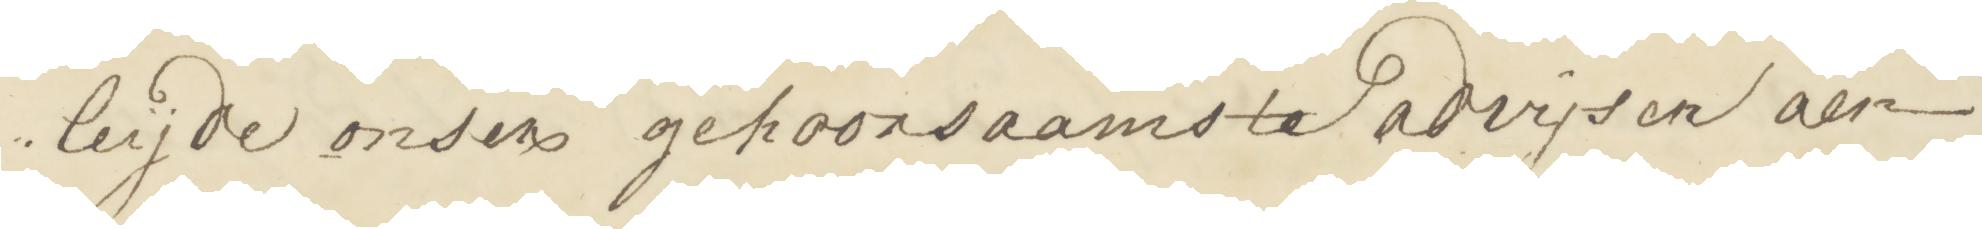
,leijde onser gehoorsaams te advijsen aen
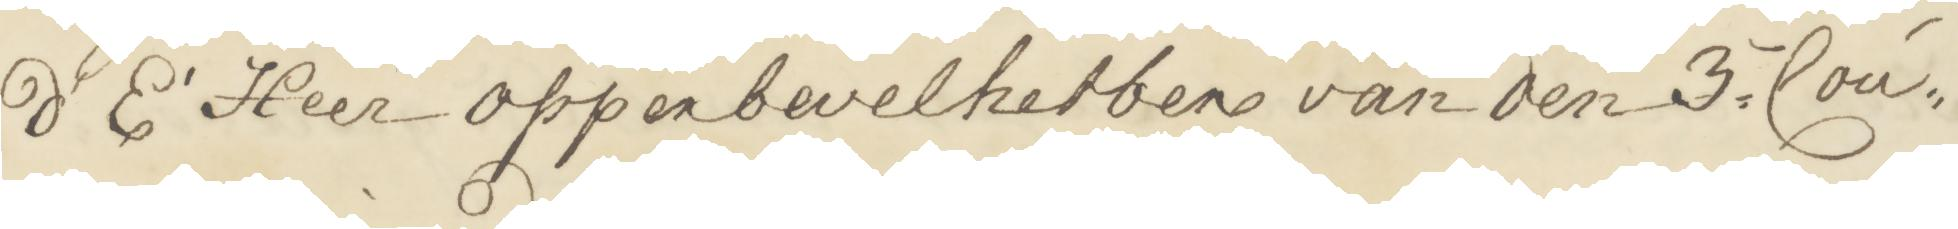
d’E' Heer opperbevelhebber van den 3=' Cou„
